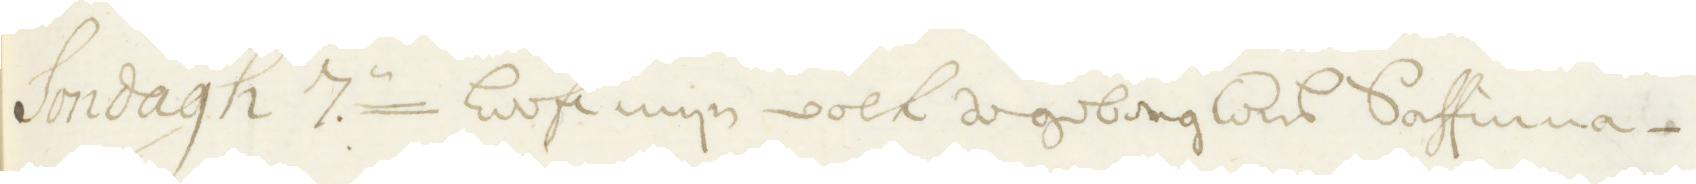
Sondagh 7.=' heeft mijn volk de gebergtens saffinna —
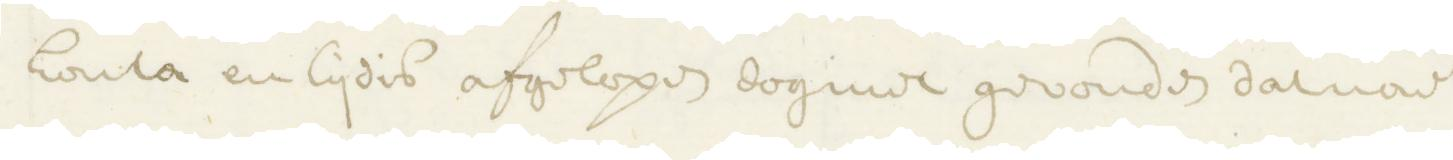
honta en tijdis afgelopen dog niet gevonden dat nae
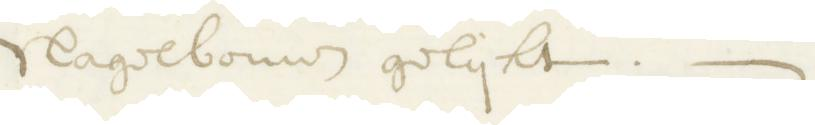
Nagelbomen gelijkt. —
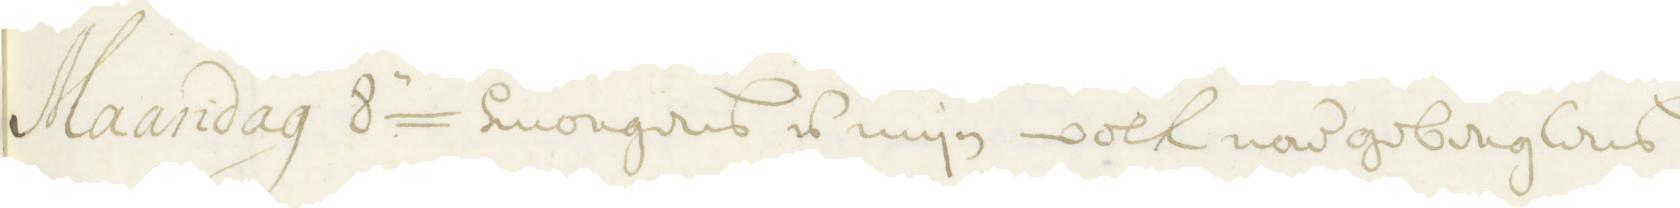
Maandag 8=' smorgens is mijn volk nae gebergtens
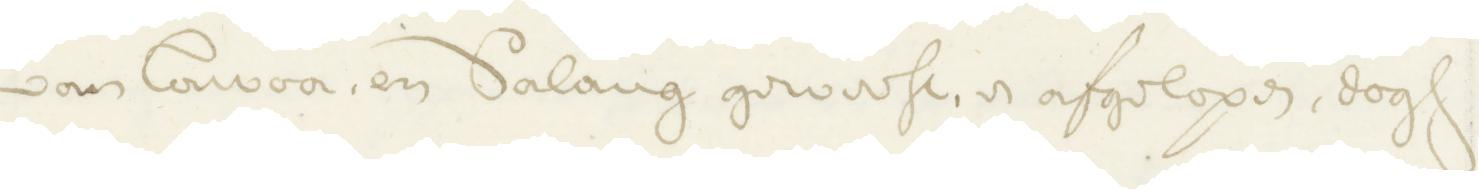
van Tawoor, en Salang geweest, en afgelopen, dogh
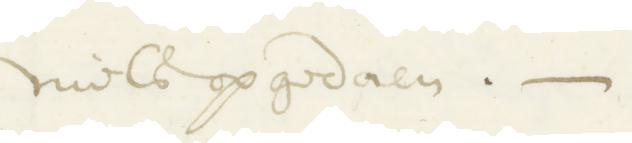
niets op gedaen. —
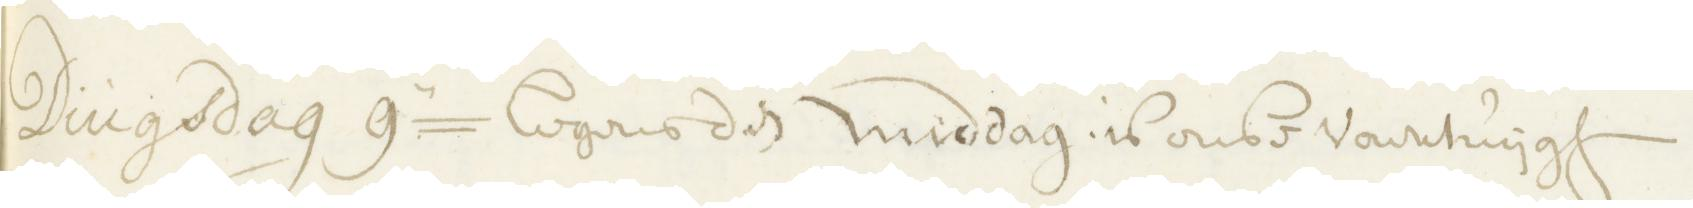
Dingsdag 9=' Tegens den middag is onse vaertuijgh
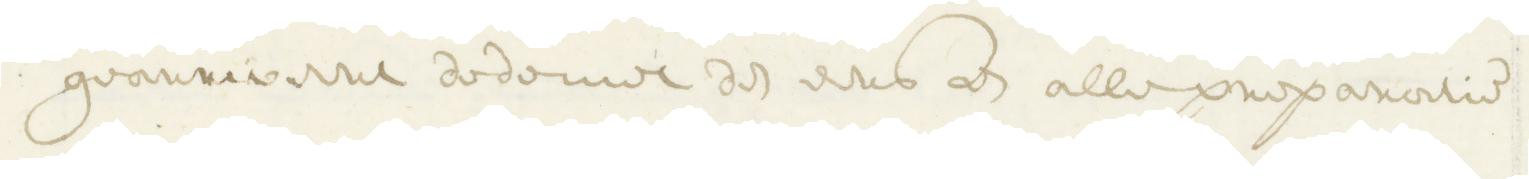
gearriveert dedemet den eersten alle preparatie
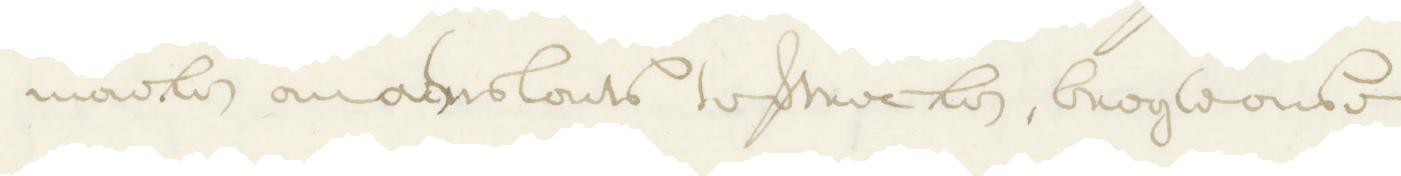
maeken om aenstonts te vertrecken, bragte onse
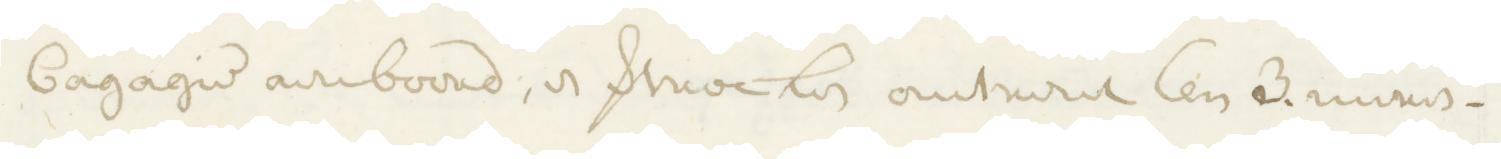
bagagie aenboord, en vertrocken omtrent ten 3. uuren —
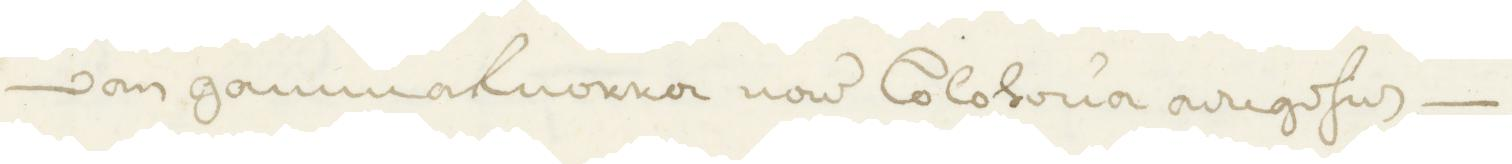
van gammaknorra nae Tolosoua aengesien —
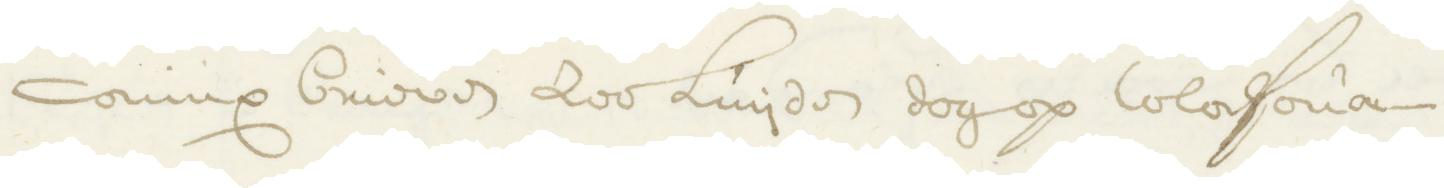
coninx brieven zoo luijden dog op tolasoua —
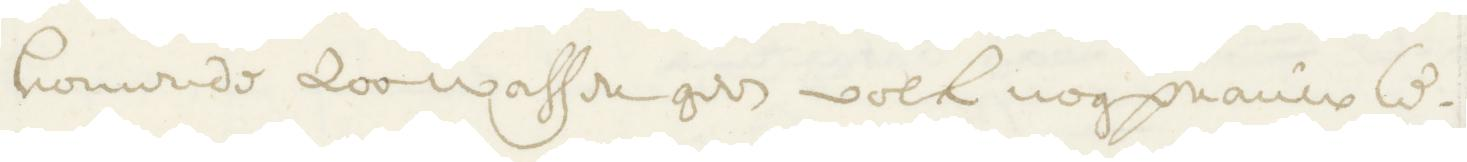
komende zoo wasser geen volk nog prauw te —
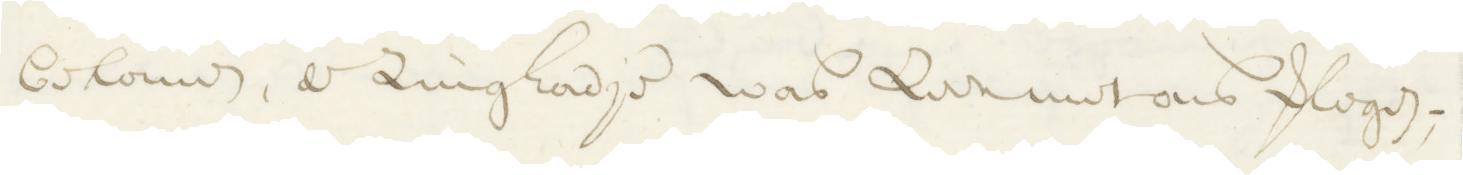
bekomen, de zinghadje was zeer met ons verlegen, —
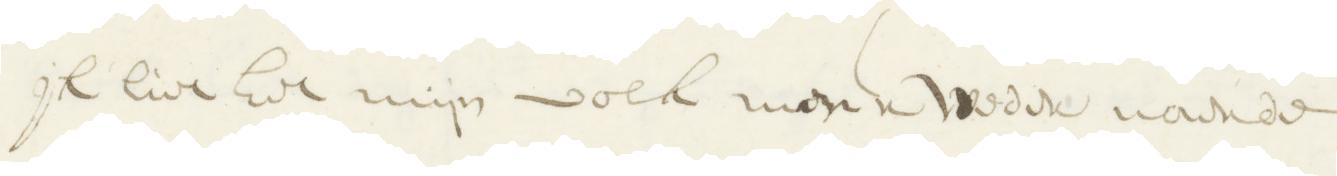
jk liet het mijn volk maer weder naer de
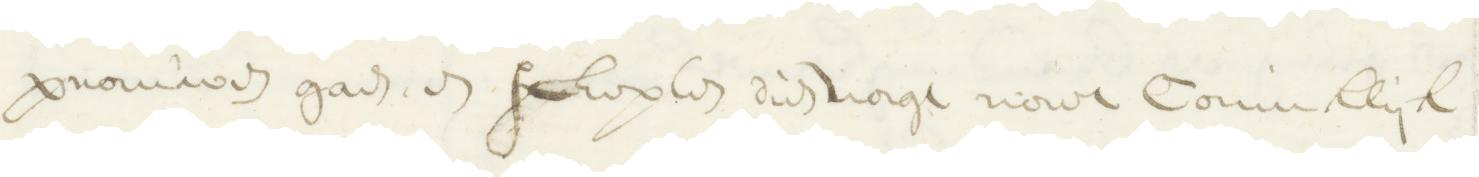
prauwen gaen en schepten dien nagt naer Coninklijk
